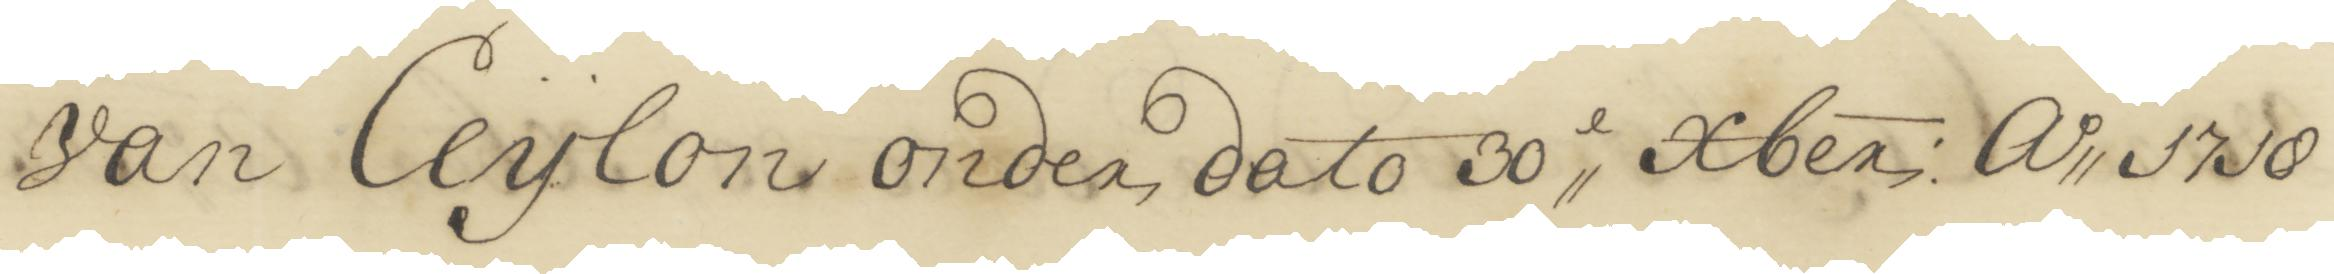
van Ceijlon onder dato 30„e xber: A„o 1718
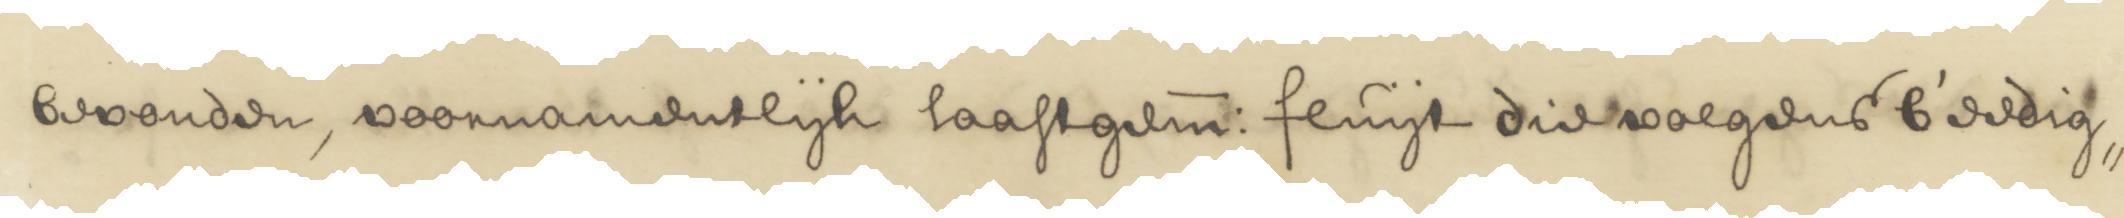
bevonden, voornamentlijk laast gem: fluijt die volgens b'eedig„
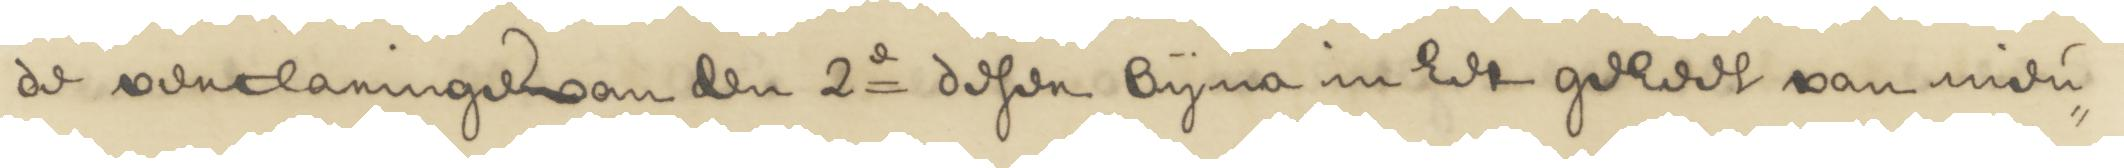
de verclaringe van den 2=e deser bijna in het geheel van nieu„
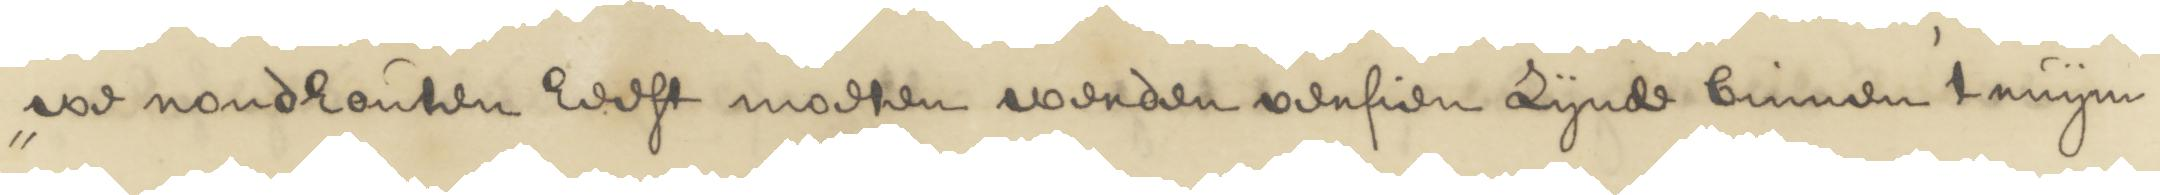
„we rondhouten heeft moeten werden versien zijnde binnen ’t ruijm
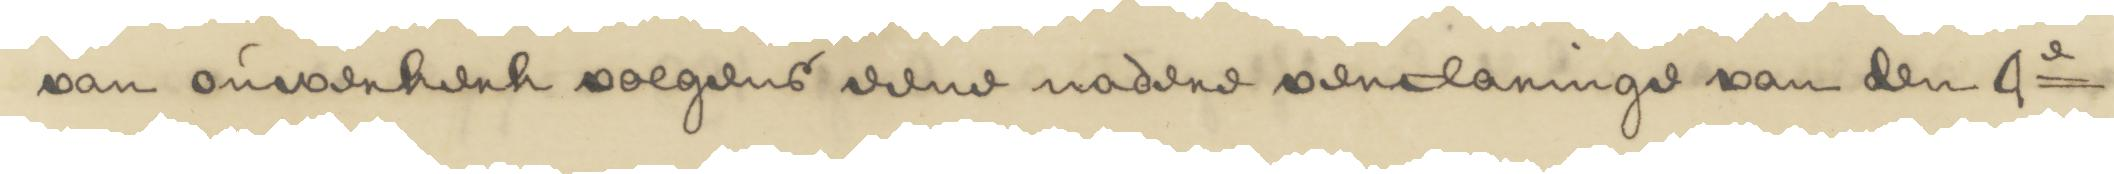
van ouwerkerk volgens eene nadere verclaringe van den 4=e
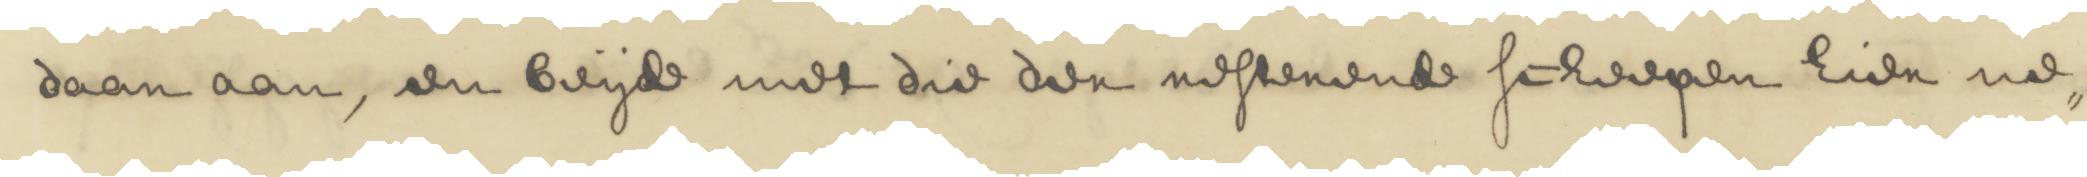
daar aan, en beijde met die der resterende scheepen hier ne„
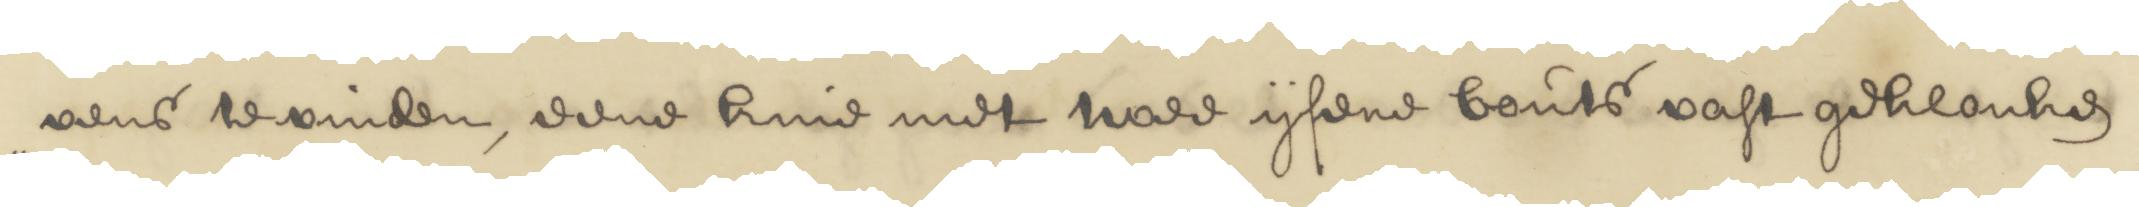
vens te vinden, eene knie met twee ijsere bouts vast geklonken
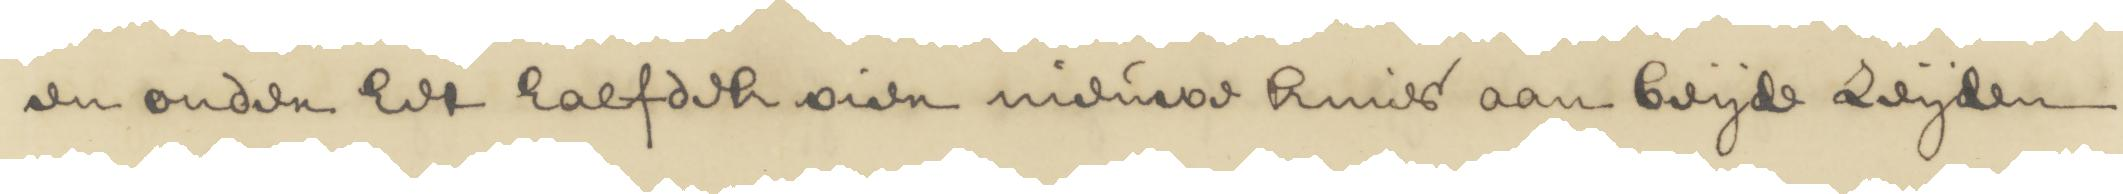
en onder het halfdek vier nieuwe knies aan beijde zeijden
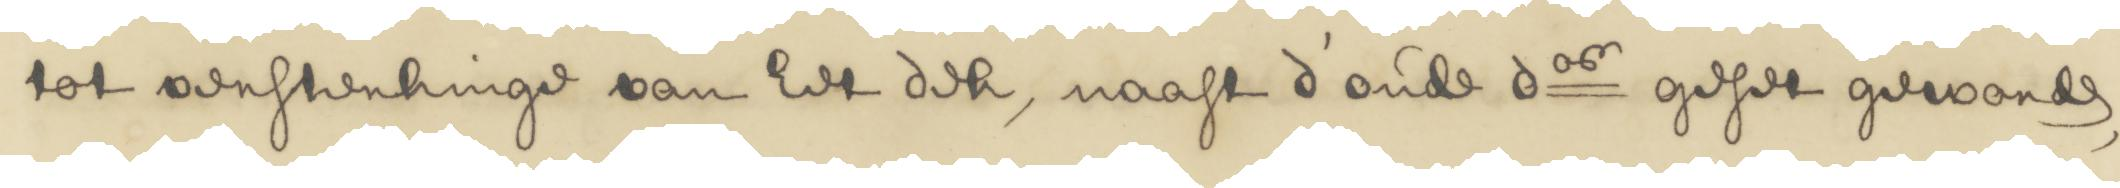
tot versterkinge van het dek, naast d’oude d=os geset geworden,
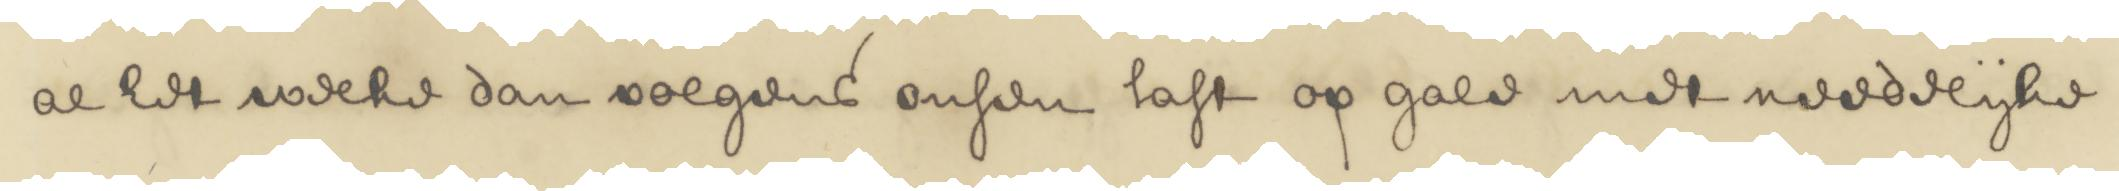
al het welke dan volgens onsen last op gale met reedelijke
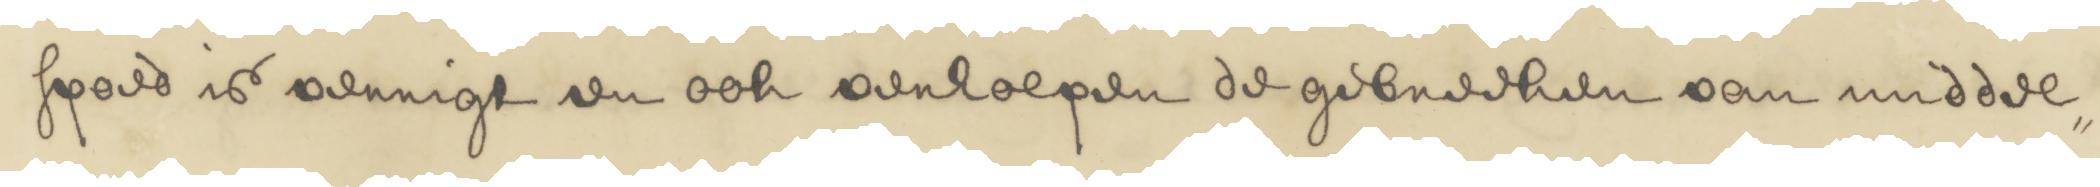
spoed is verrigt en ook verholpen de gebreeken van middel„
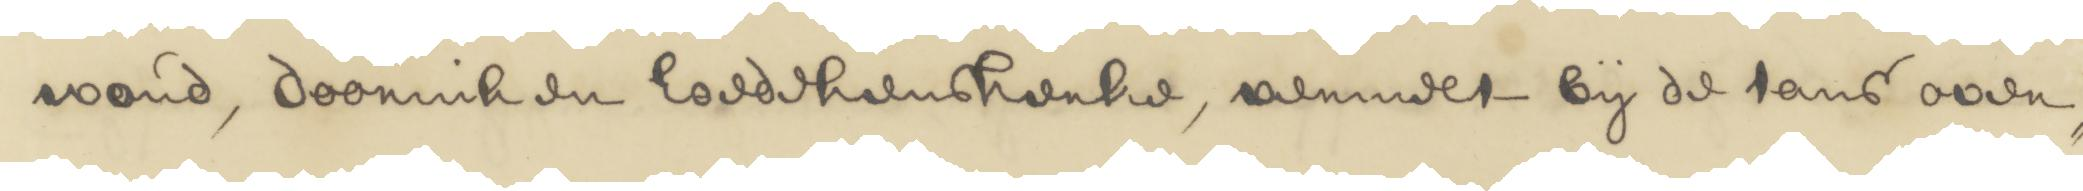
woud, doornik en hoedekenskerke, vermelt bij de tans over„
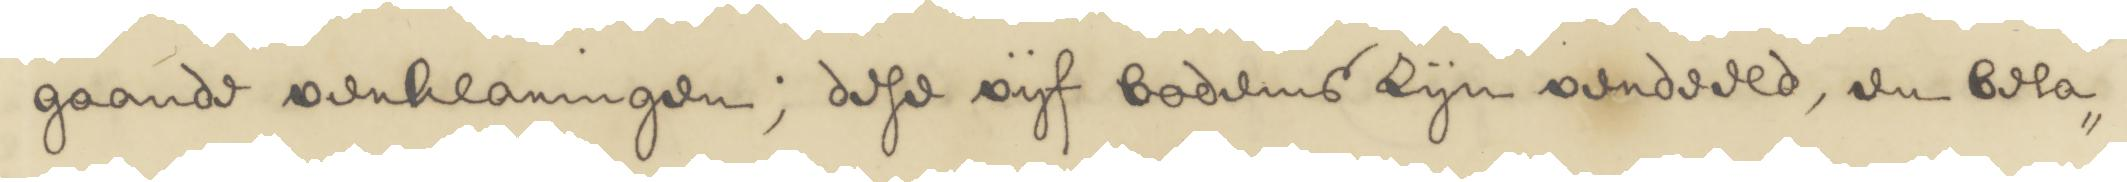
gaande verklaringen; dese vijf bodems zijn verdeeld, en bela„
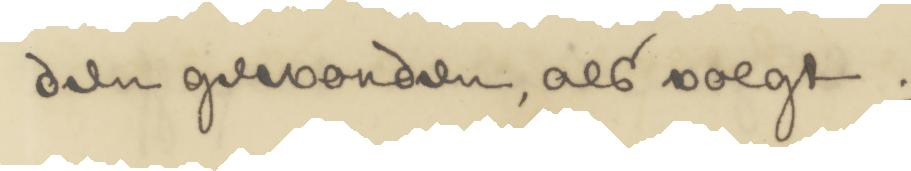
den geworden, als volgt.
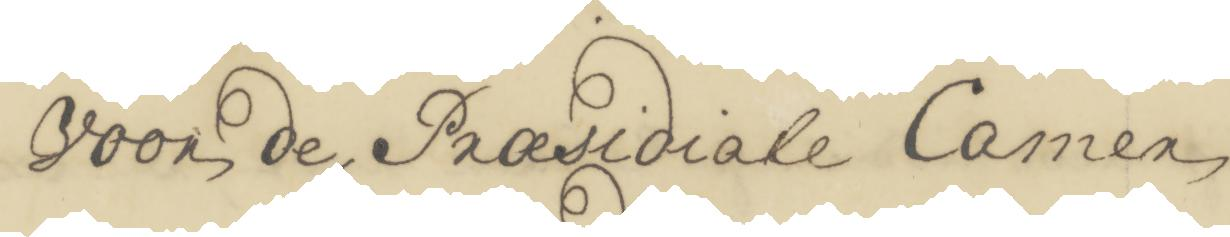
voor de Praesidiale Camer
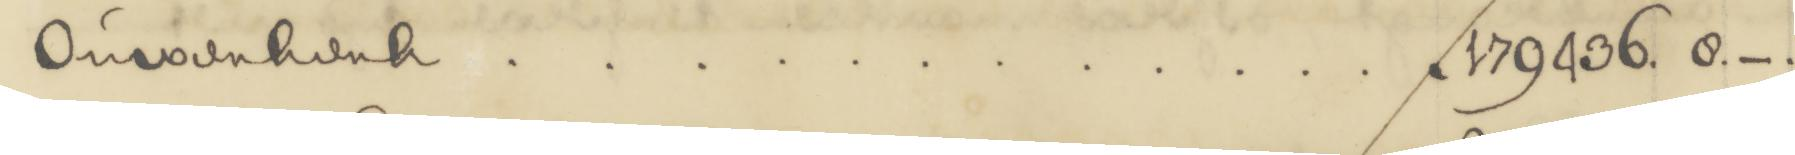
Ouwerkerk . . . . . . . . . . . . ƒ179436.8.—.
